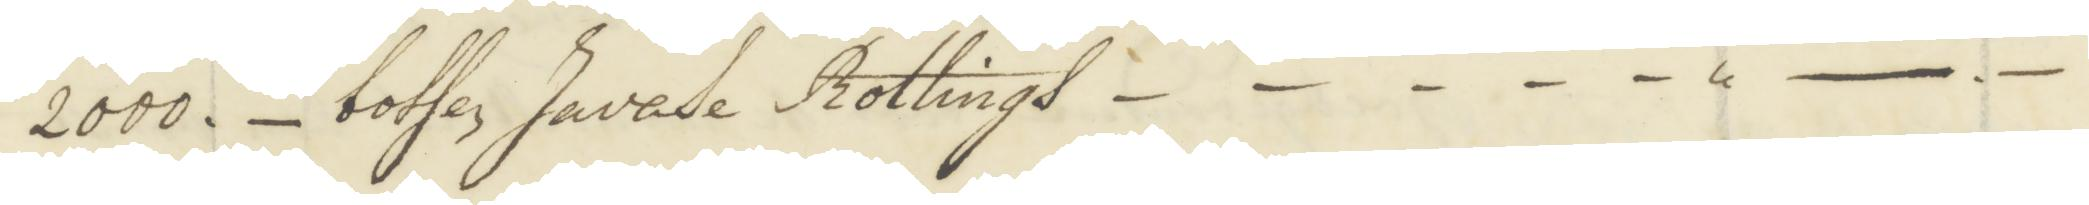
2000. — bossen Javase Rottings - - - - - „ —. —
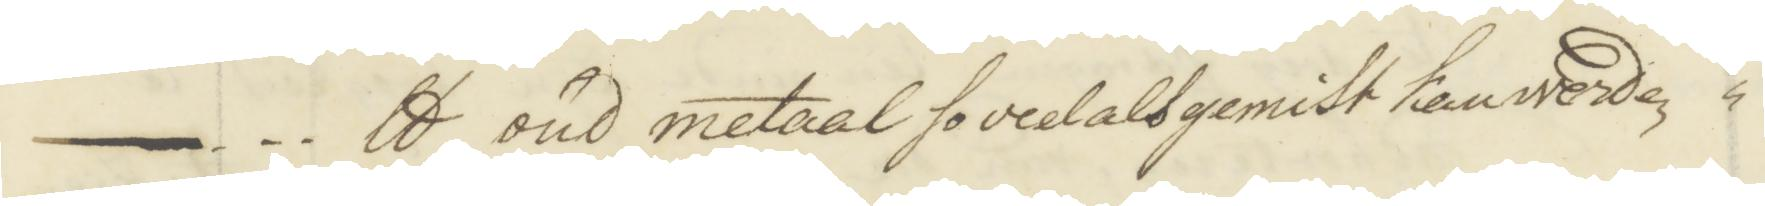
—. - - lb oud metaal so veel als gemist kanwerden „
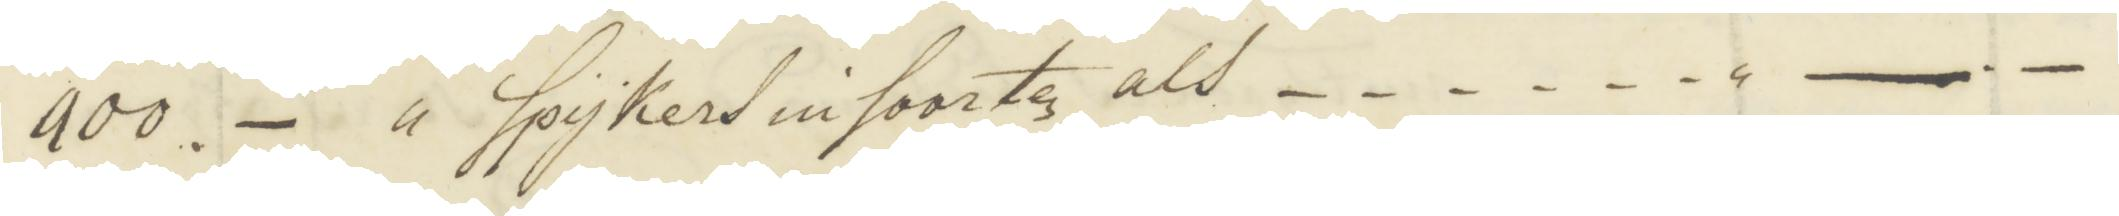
400. — „ spijkers in soorten als - - - - - - „ —. —
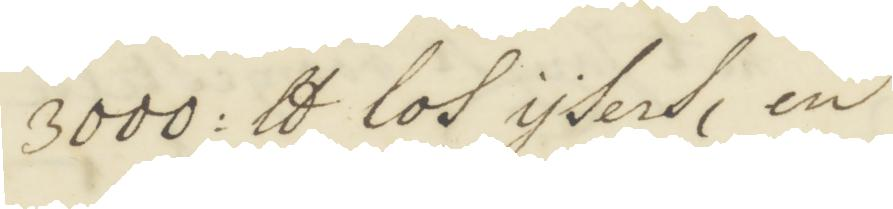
3000: lb los ijsers, en
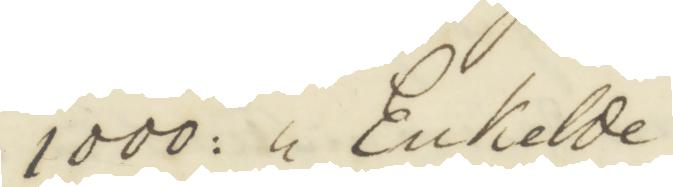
1000: „ Enkelde
